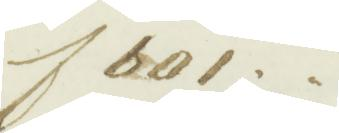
ƒ601; -
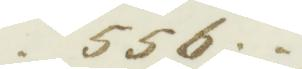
„ 556; -
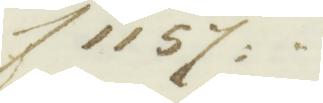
ƒ1157: -
